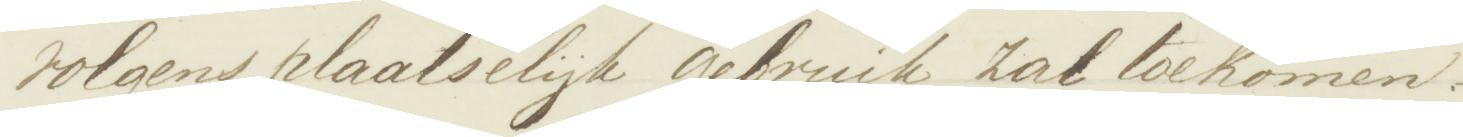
volgens plaatselijk gebruik zal toekomen. —
